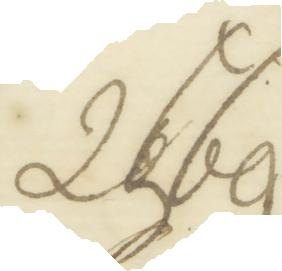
2569
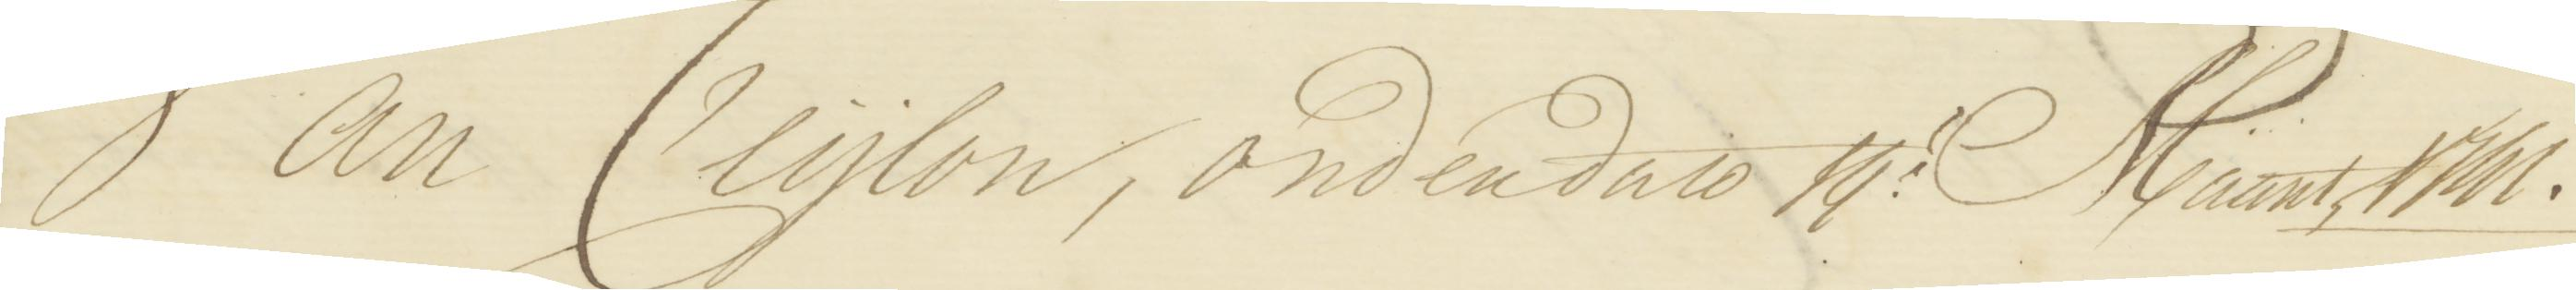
Van Ceijlon, onder dato 14:' Maart, 1741.
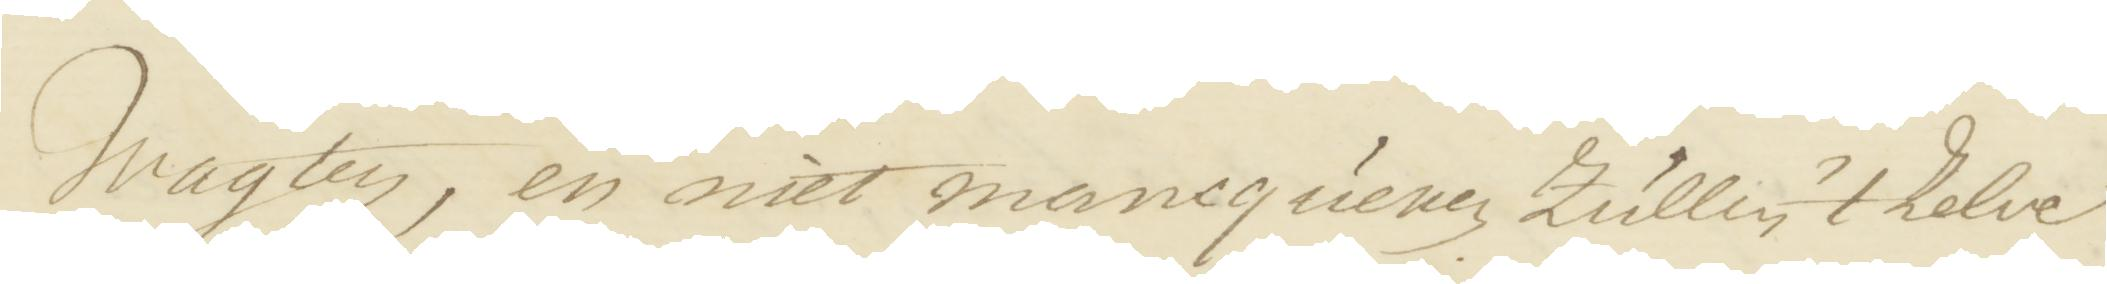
wagten, en niet mancqueren zullen ’t zelve
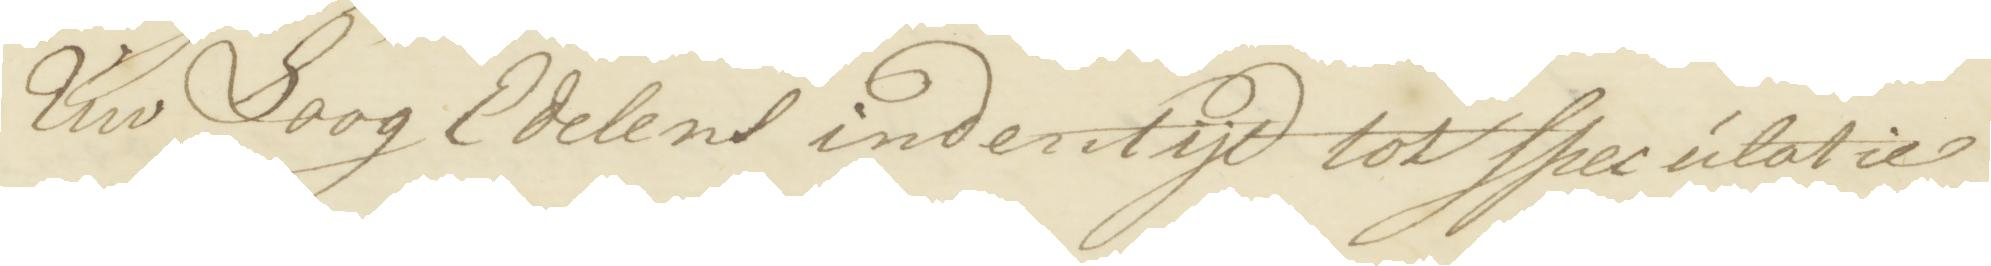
Uw hoog Edelens inder tijd tot speculatie
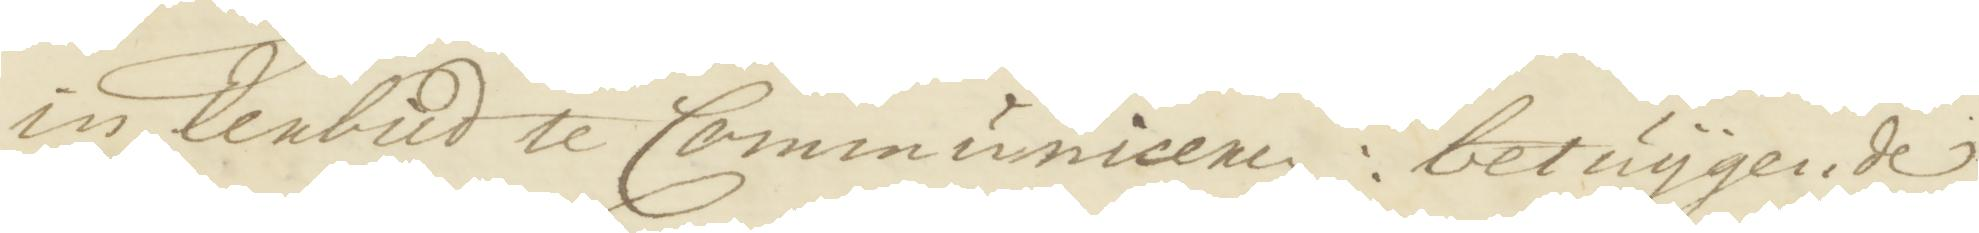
in Eerbied te Communiceren : betuijgende
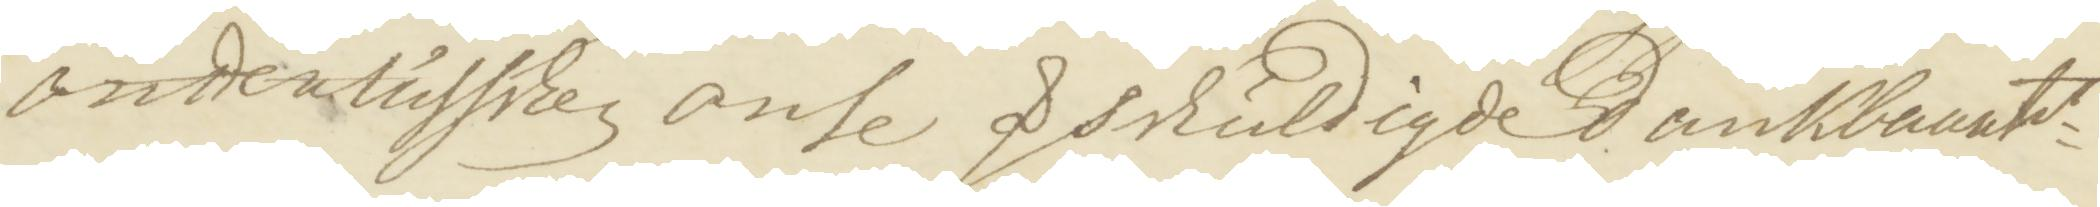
ondertusschen onse verschuldigde dankbaarsc=t
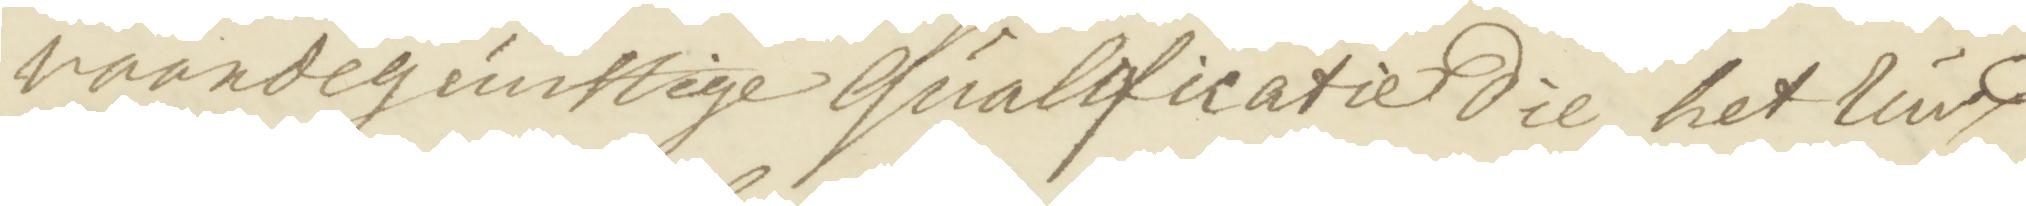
voorde gunstige qualificatie die het uw
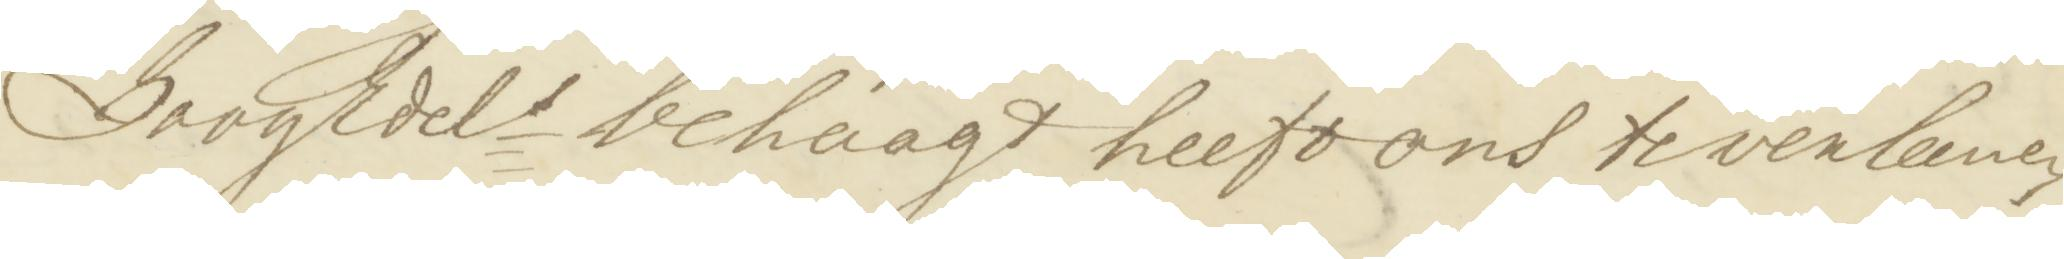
Hoog Edel=s behaagt heeft ons te verleenen
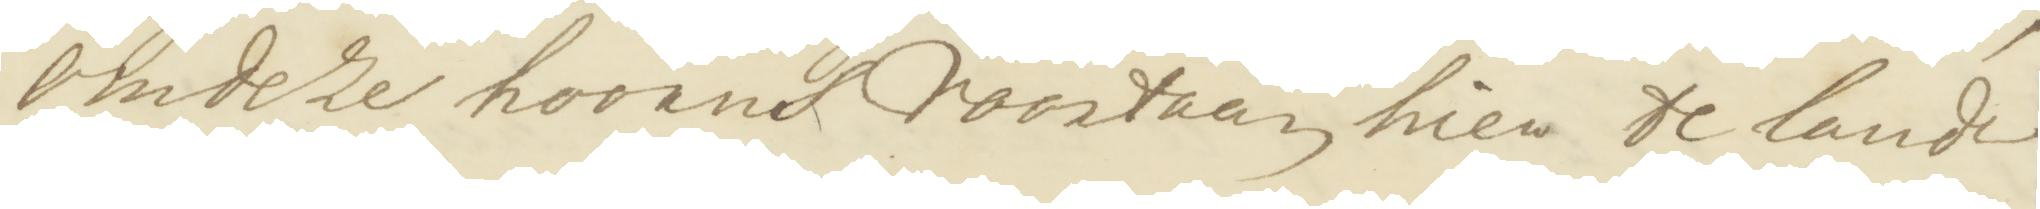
om deze hoorns voortaan hier te lande
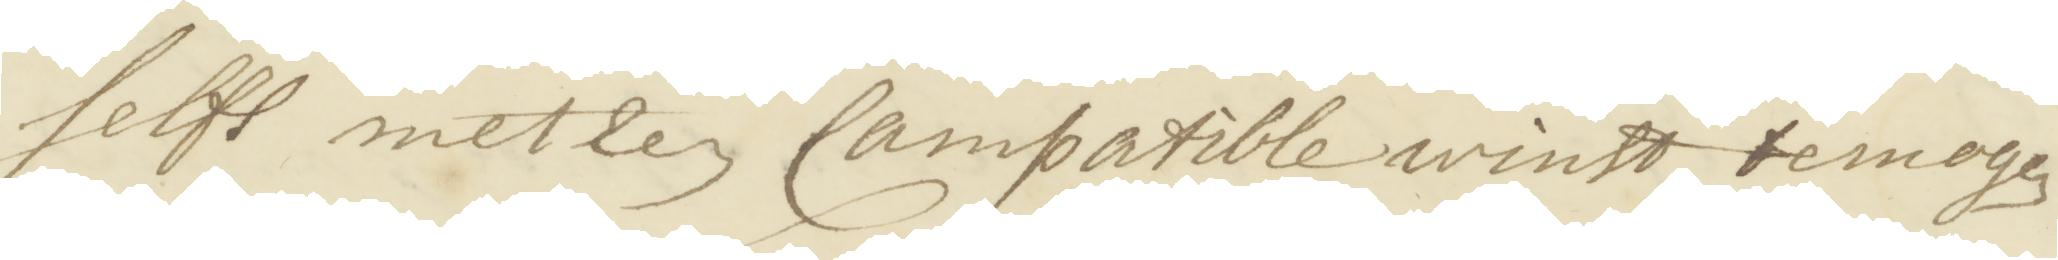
selfs met een Compatible winst te mogen
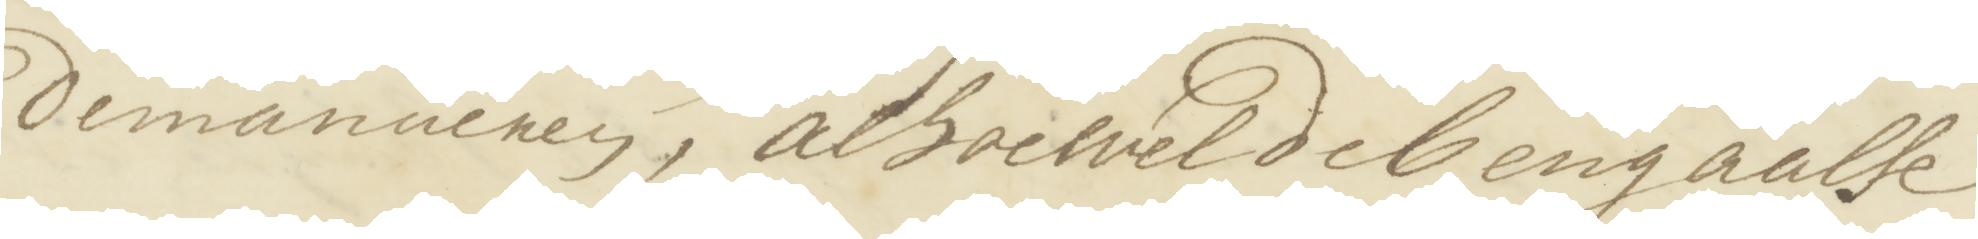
demanueren, alhoewel de bengaalse
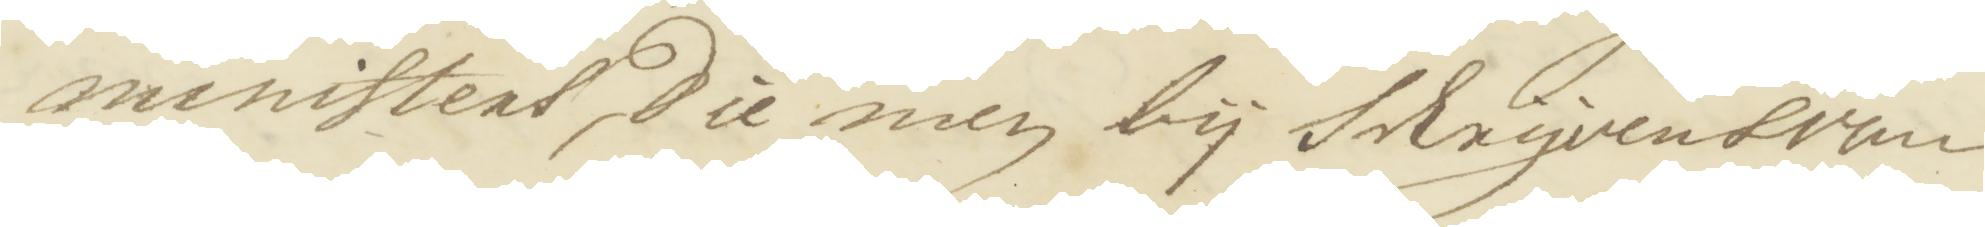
ministers, die men bij schrijvens van
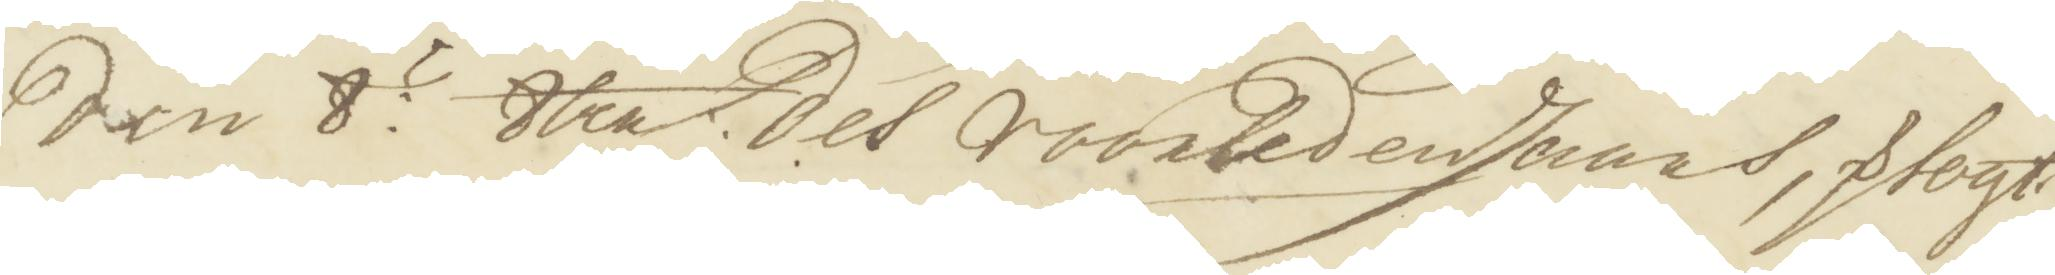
den 8:e 8ber: des voorleden Jaars, versogt.
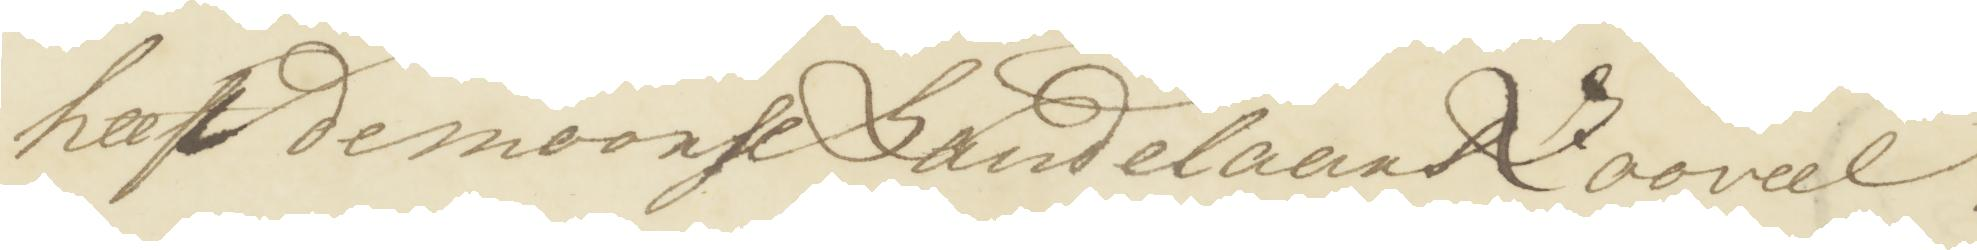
heeft de moorse handelaars Zooveel
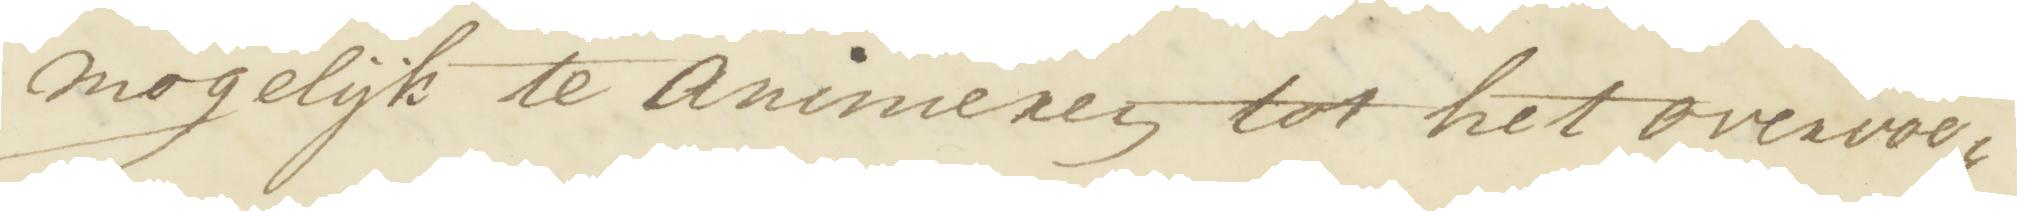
mogelijk te animeren tot het overvoe„
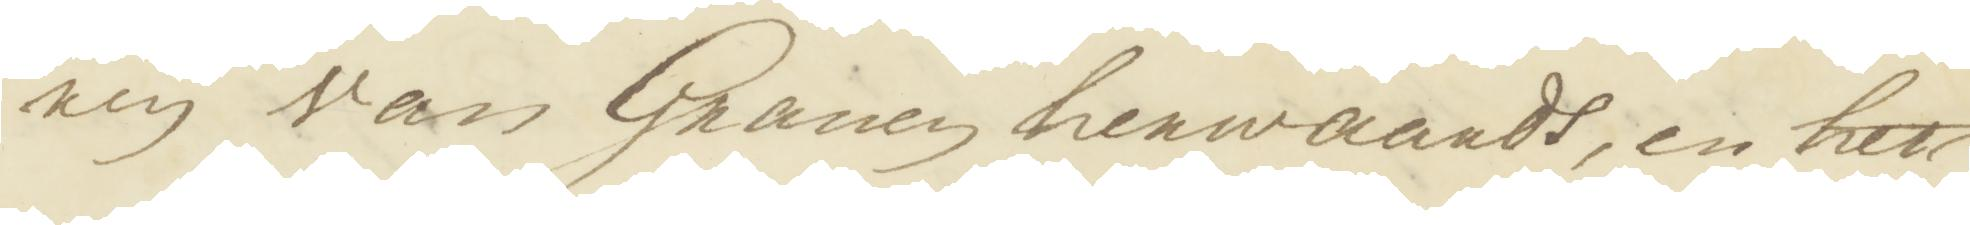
ren van Granen herwaards, en het
